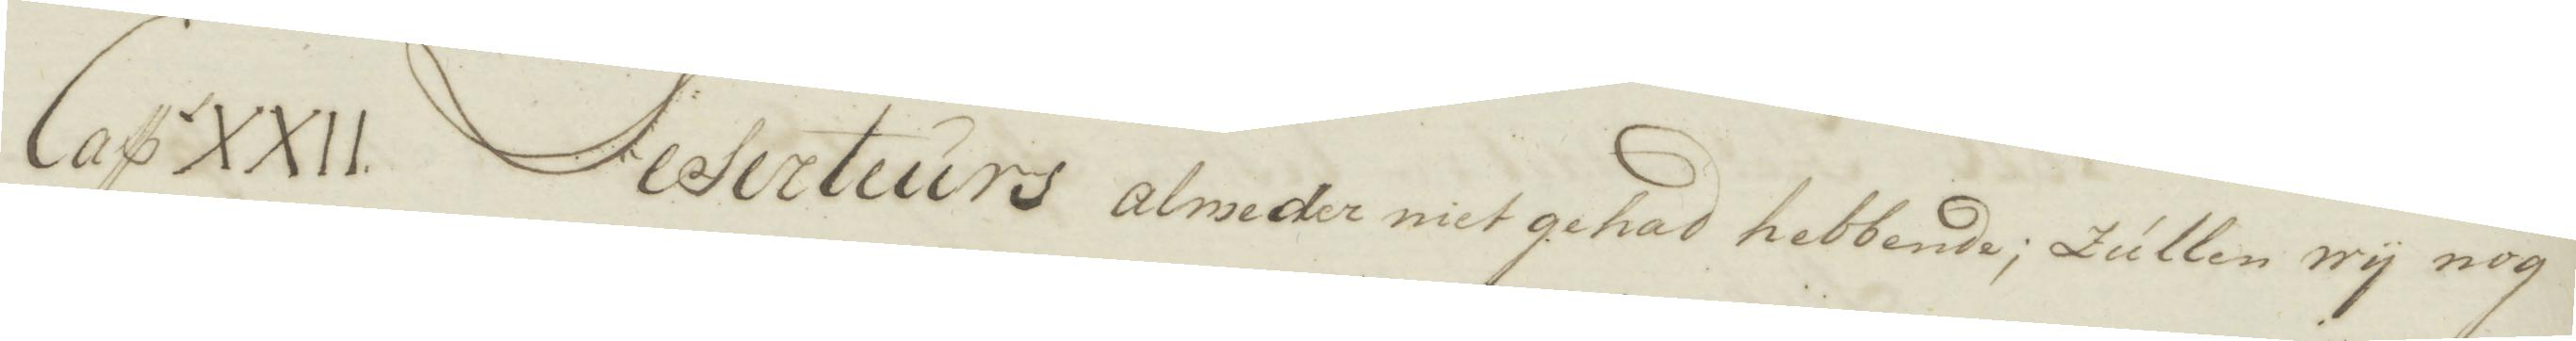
Cap XXII. Deserteurs alweder niet gehad hebbende; zullen wij nog
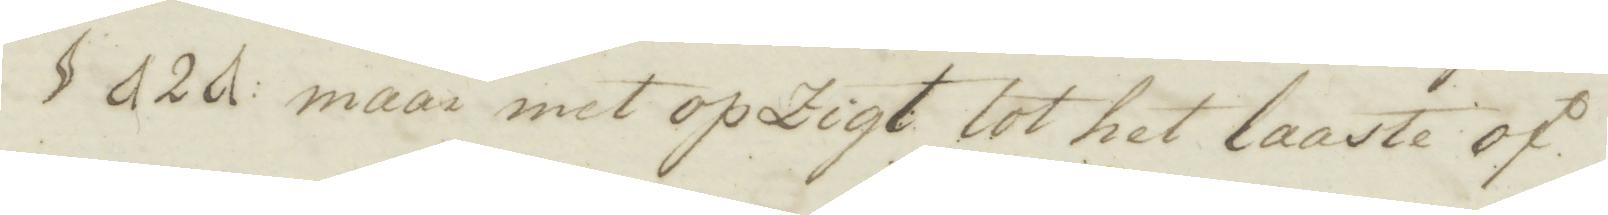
§ 424: maar met opzigt tot het laaste of
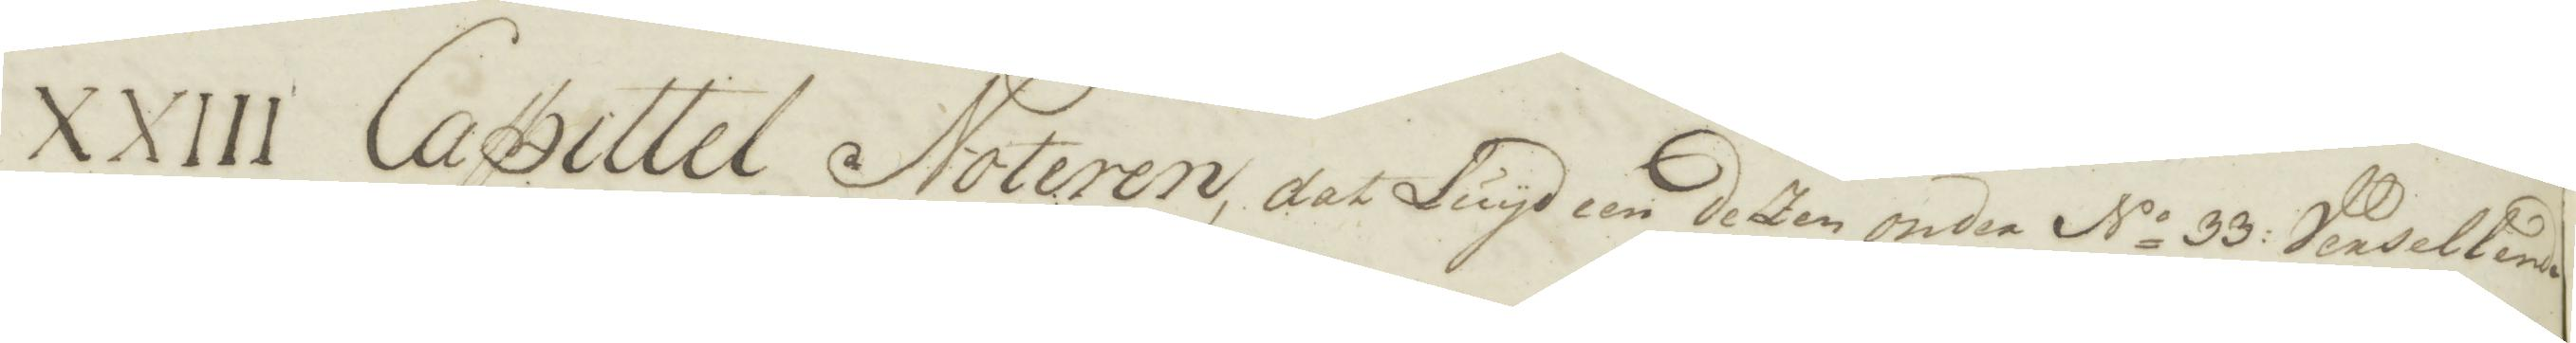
XXIII Cappittel Noteren, dat Luijd een dezen onder N=o 33: Versellende
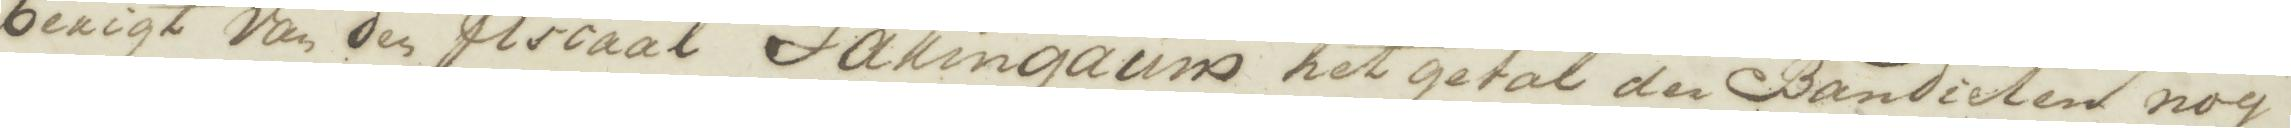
berigt van den fiscaal Paringauw het getal der Bandieten nog
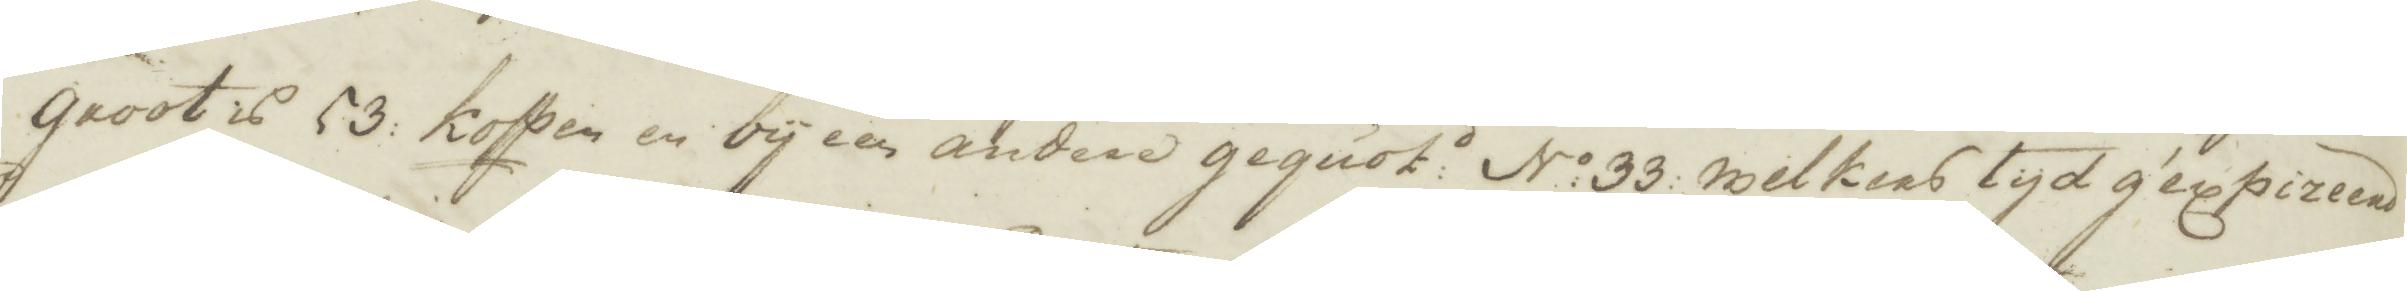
groot is 53: koppen en bij een andere gequot:d N:o 33: welkers tijd g’expireerd
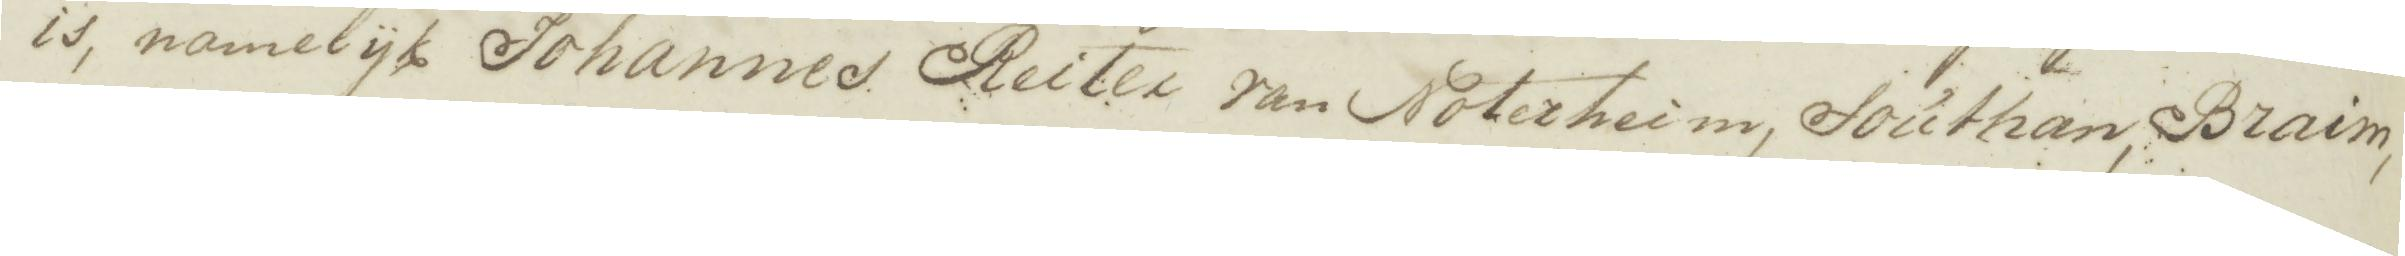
is, namelijk Johannes Reiter van Noterheim, Southan, Braim,
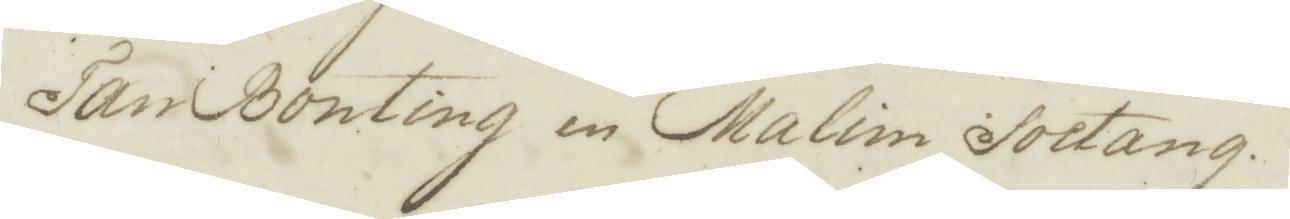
Tan Bonting en Malim Soetang.
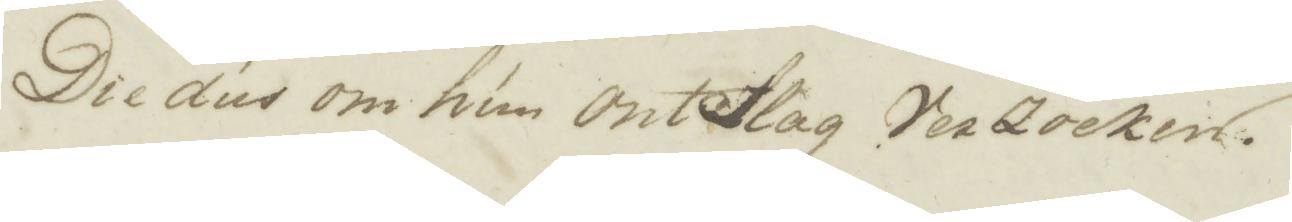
Die dus om hun ontslag verzoeken.
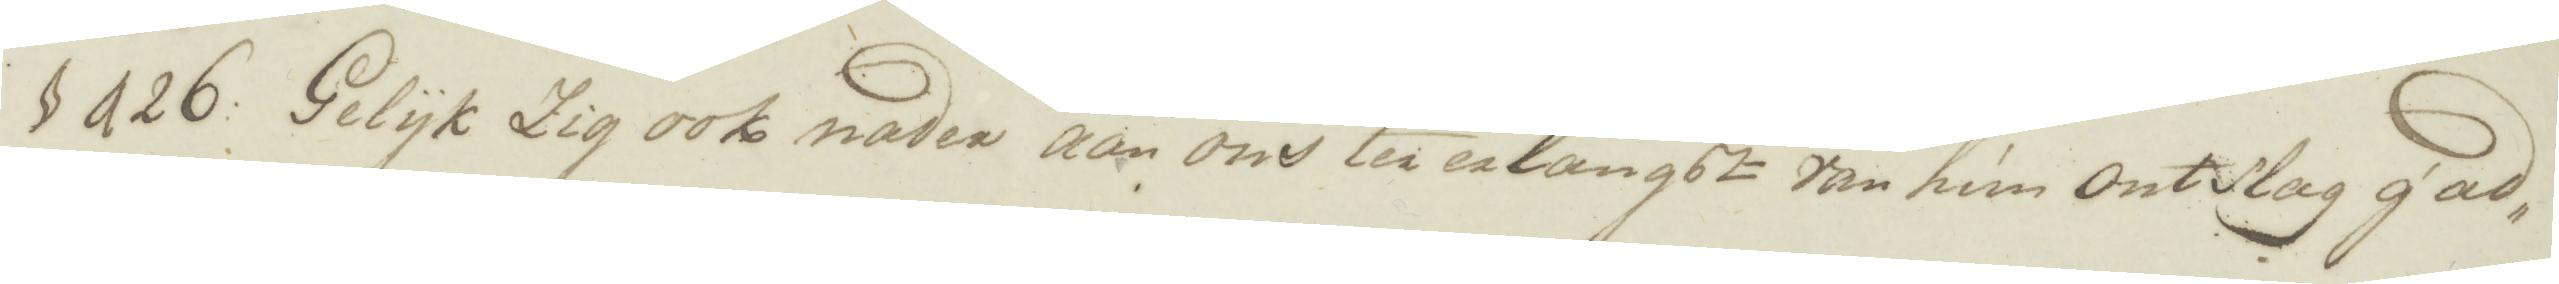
§426: Gelijk zig ook nader aan ons ter erlangst van hun ontslag g’ad„
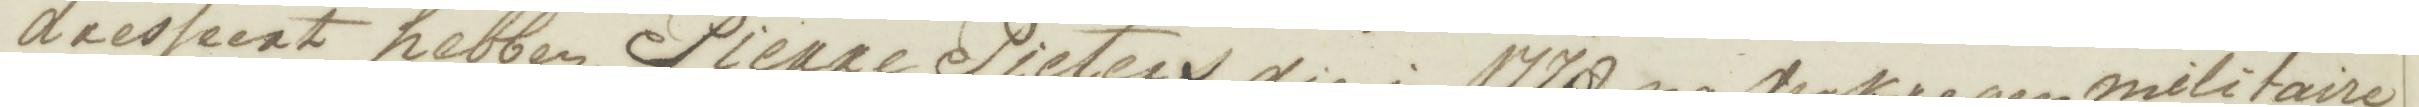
dresseert hebben, Pierre Pieters die in 1778: na verkregen militaire
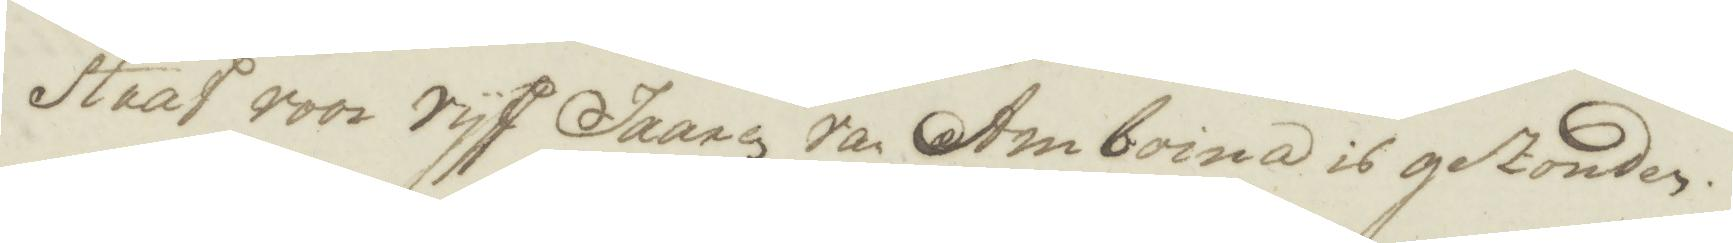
straf voor vijf Jaaren van Amboina is gezonden.
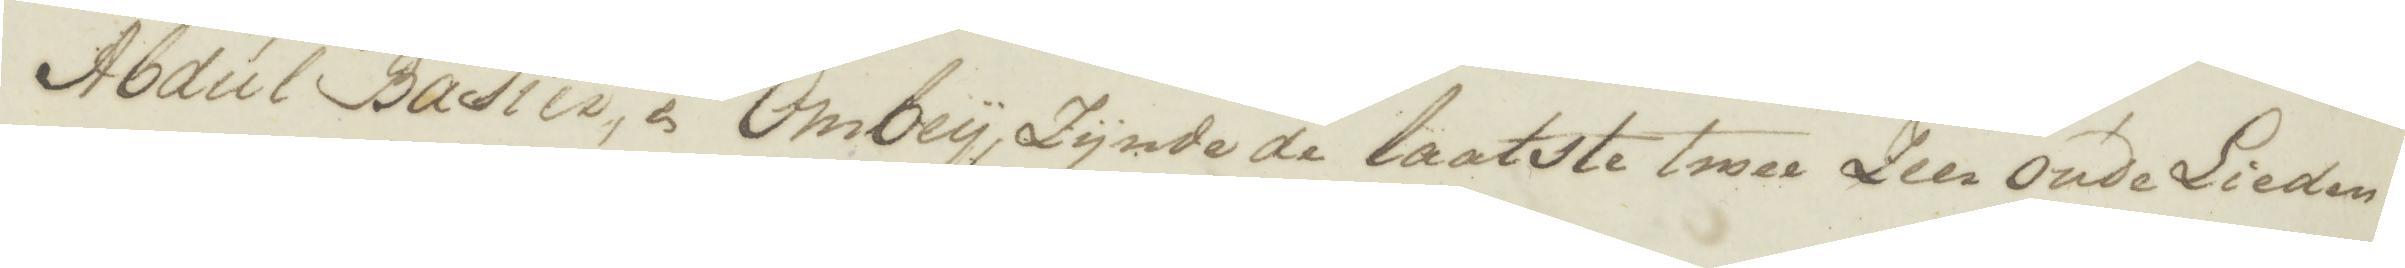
Abdul Basier, en Ombeij, zijnde de laatste twee zeer oude Lieden
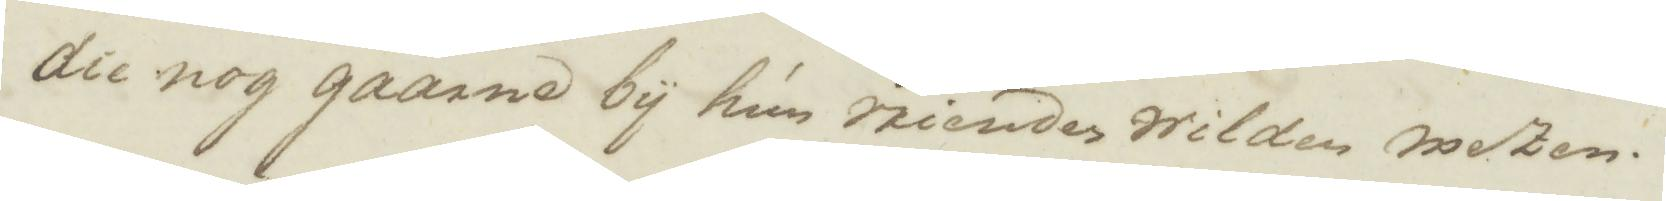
die nog gaarne bij hun vrienden wilden wezen.
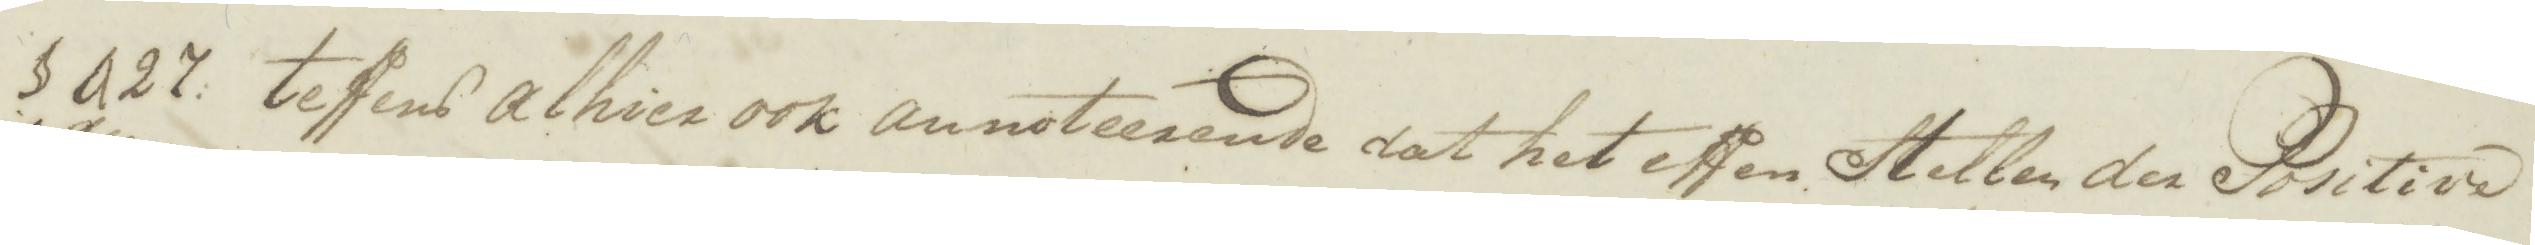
§427: teffens alhier ook annoteerende dat het effen stellen der Positive
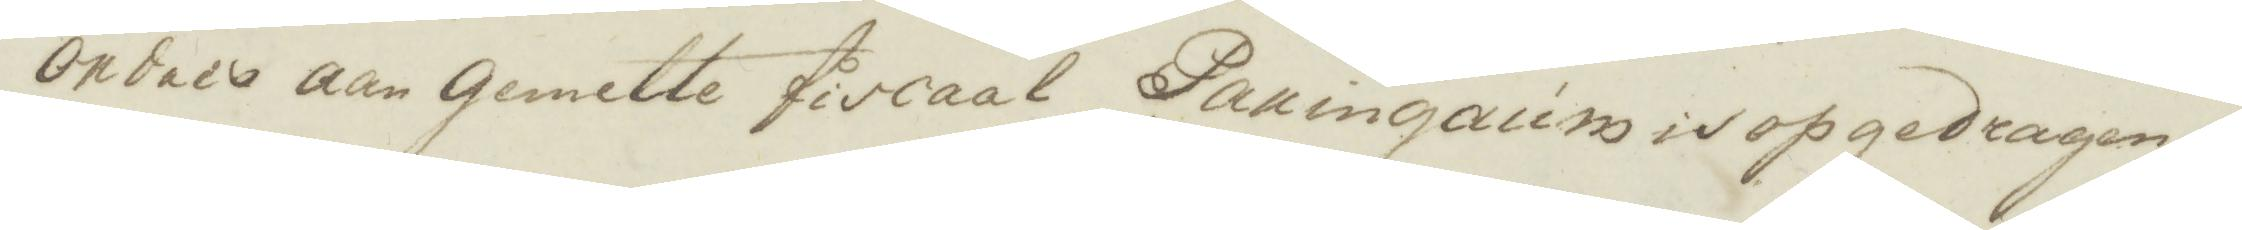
ondres aan gemelte fiscaal Paringauw is opgedragen.
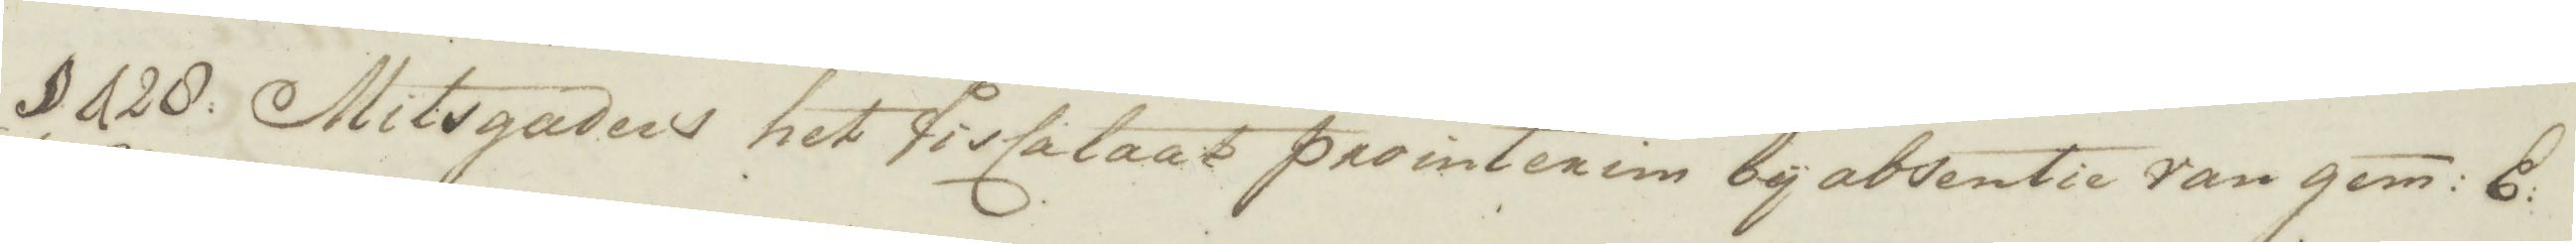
§428: Mitsgaders het fiscalaat pro interim bij absentie van gem: E:
